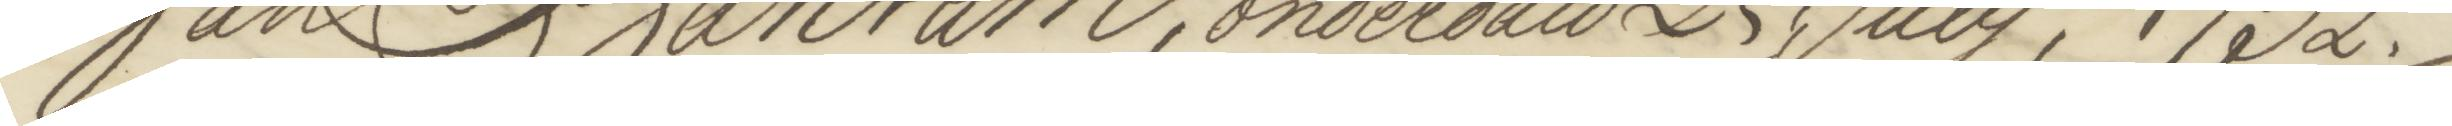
Van Bantam, onder dato 25„e Julij, 1732.
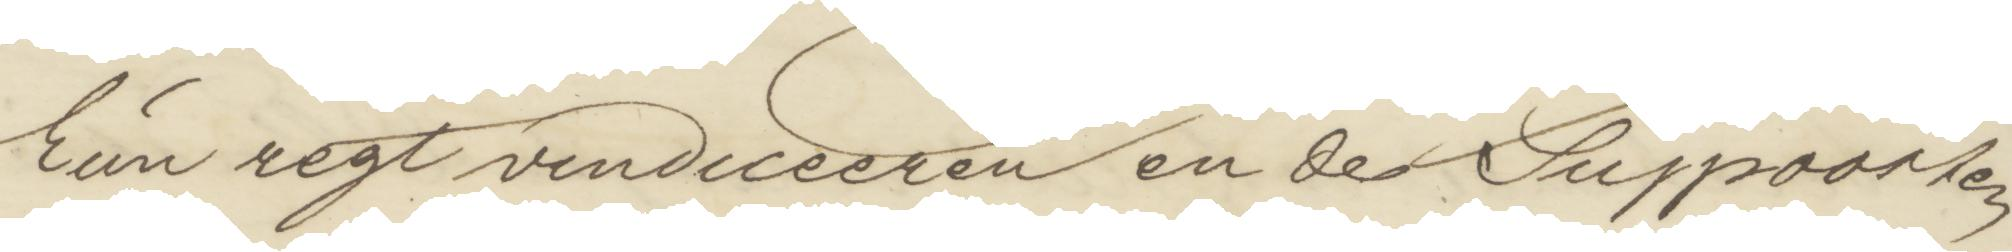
hun regt vindiceeren en de suppoosten
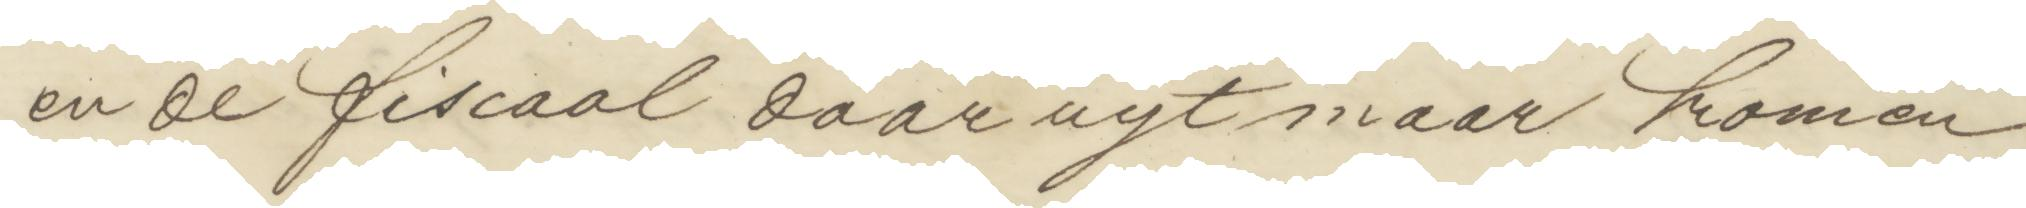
en de fiscaal daar uijt maar komen
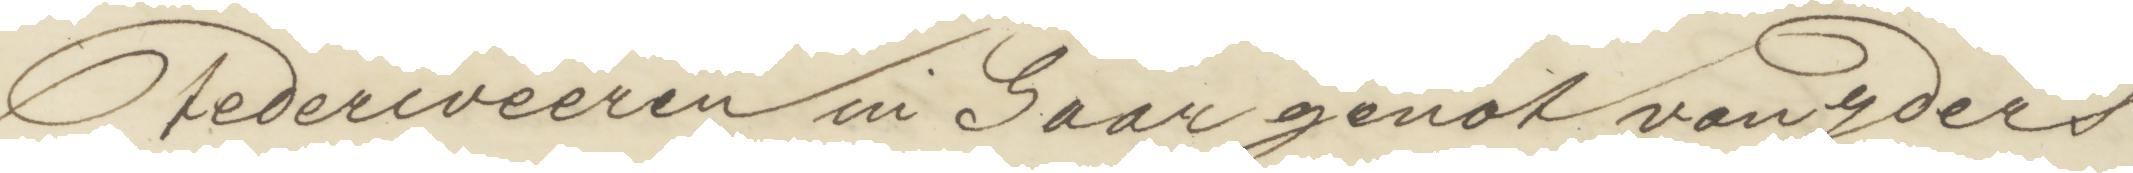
tederiveeren in haar genot van yders
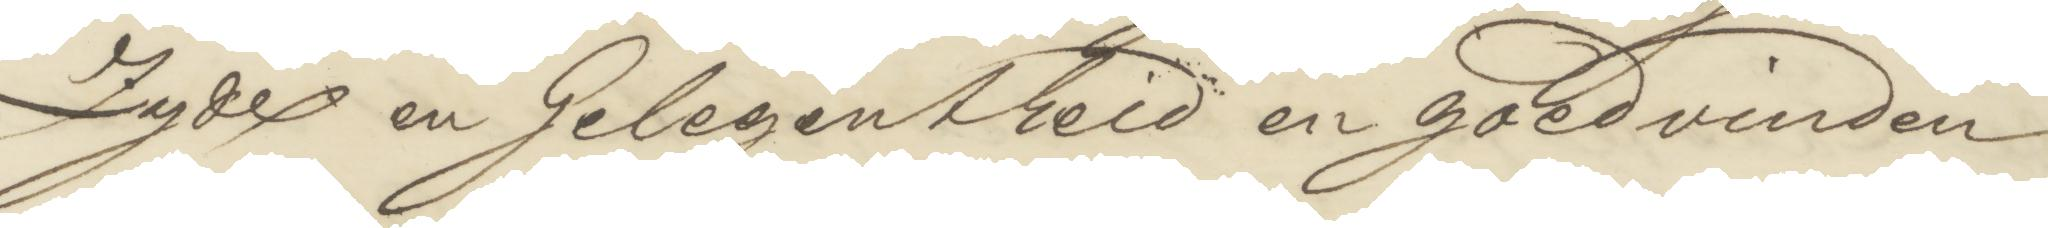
Zyde en Gelegentheid en goedvinden
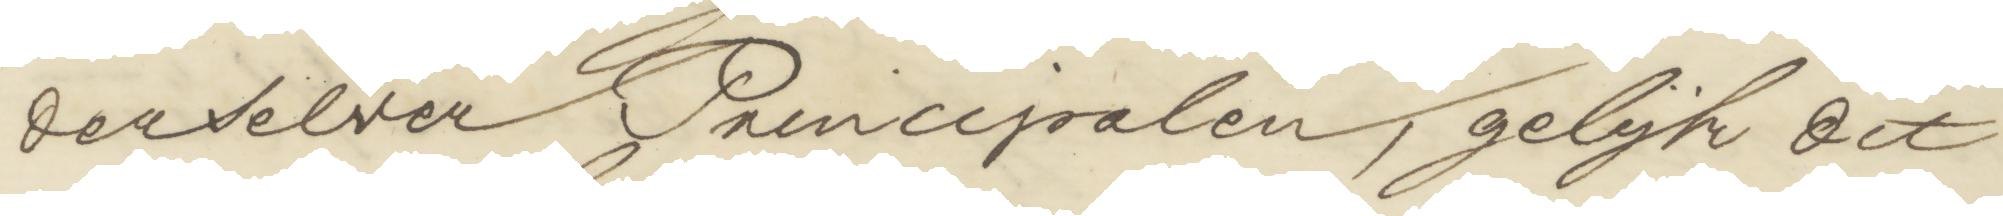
derselver Principalen, gelijk dit
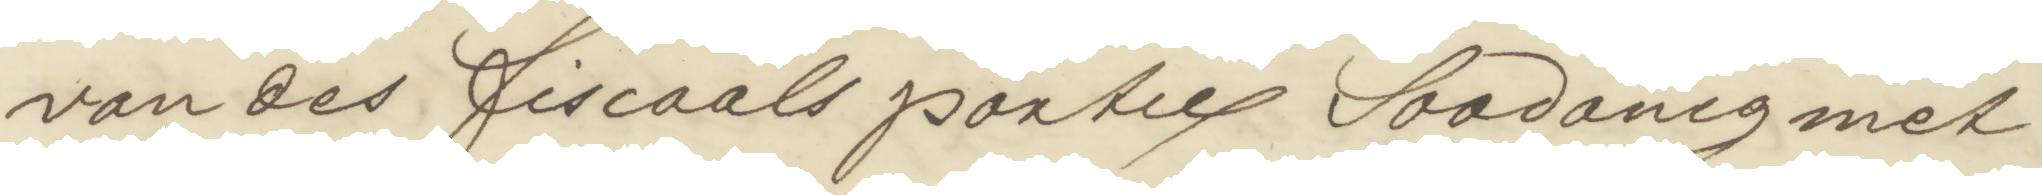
van des fiscaals portie soodanig met
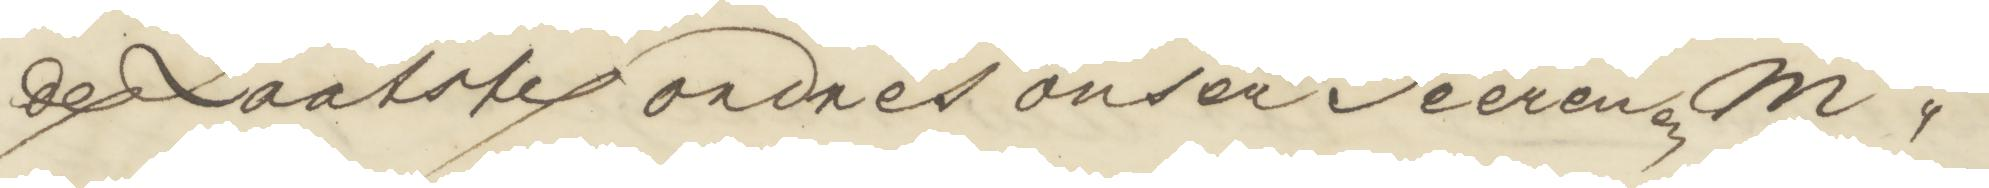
de Laatste ordres onser heeren en M„rs
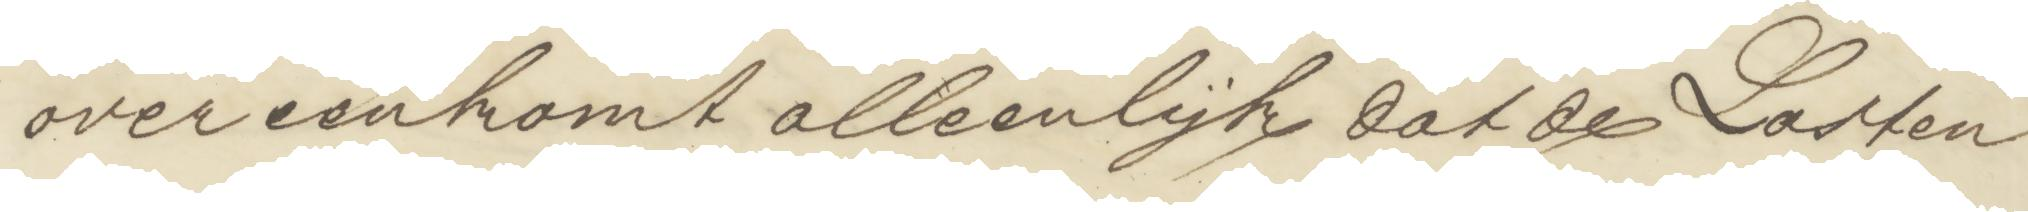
over eenkomt alleenlijk dat de Lasten
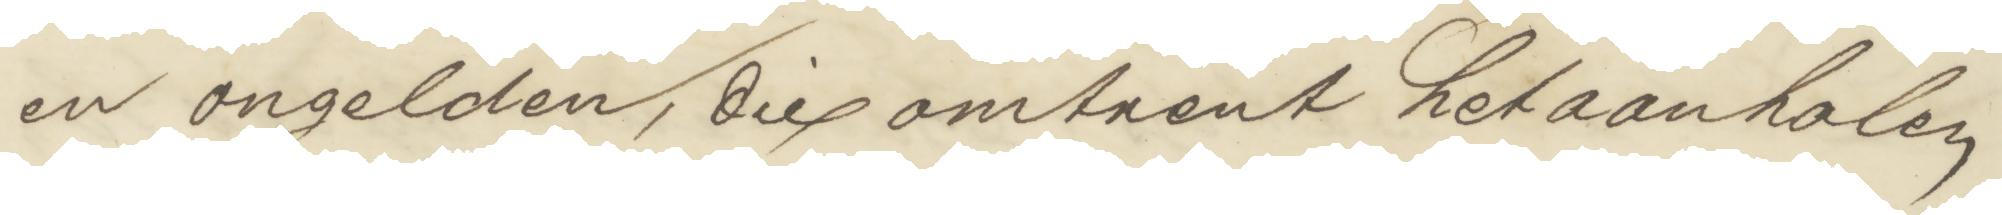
en ongelden, die omtrent het aanhalen
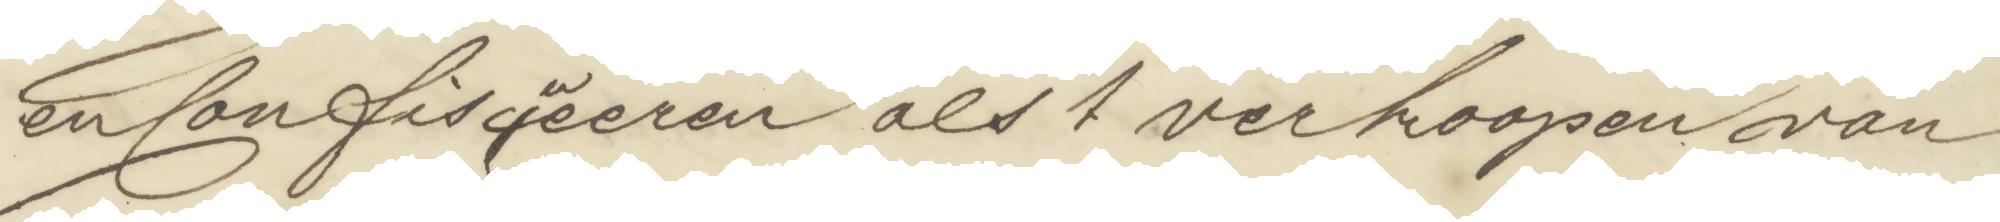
en Confisqueeren als ’t verkoopen van
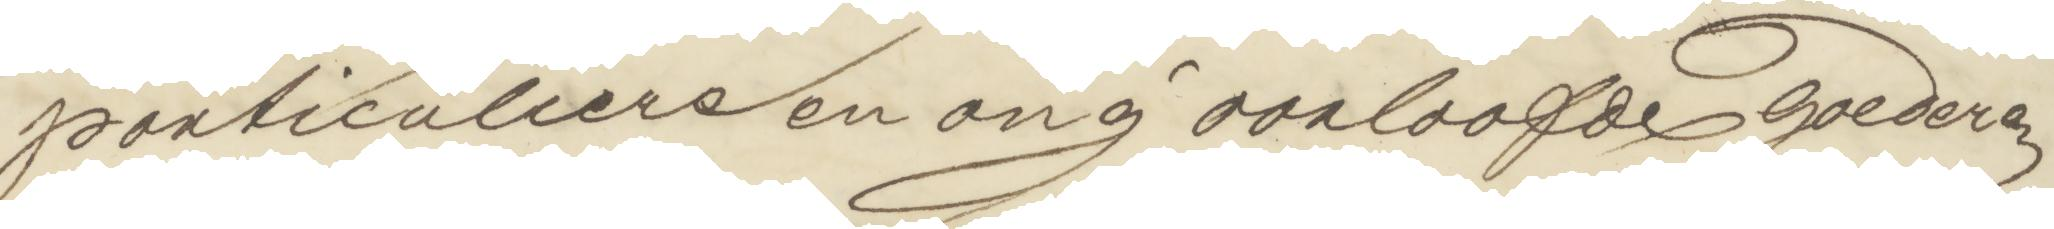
particuliere en ong’oorloofde goederen
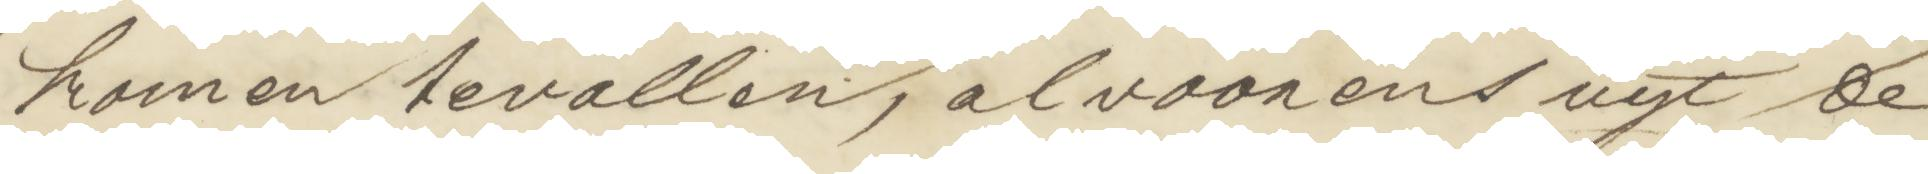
komen tevallen, alvoorens uijt de
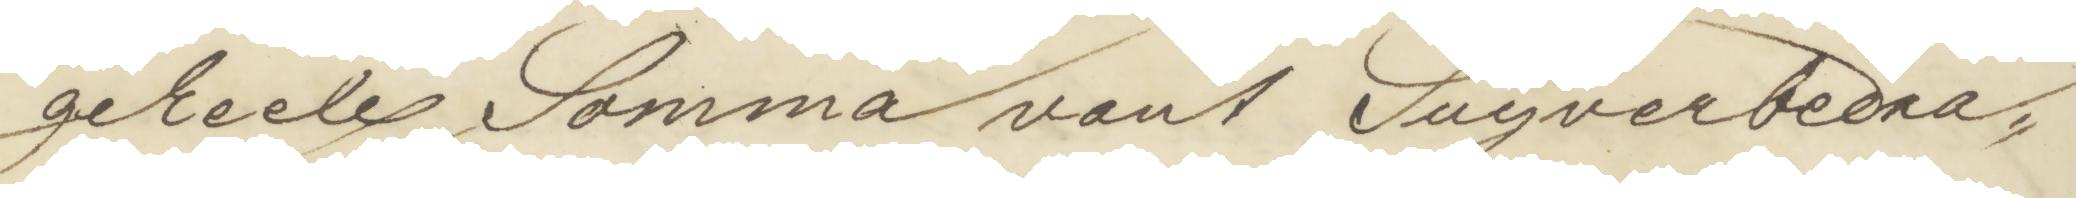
geheele Somma van’t Suijverbedra„
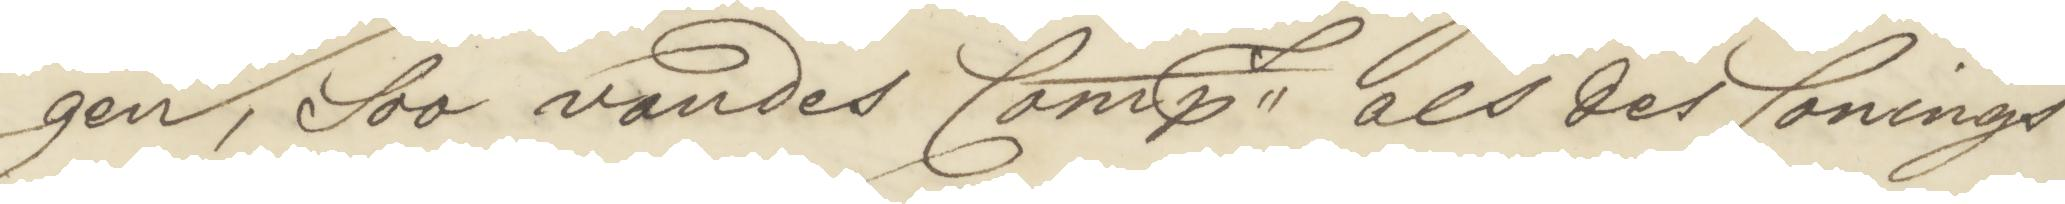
gen, soo vandes Comp„s als des Conings
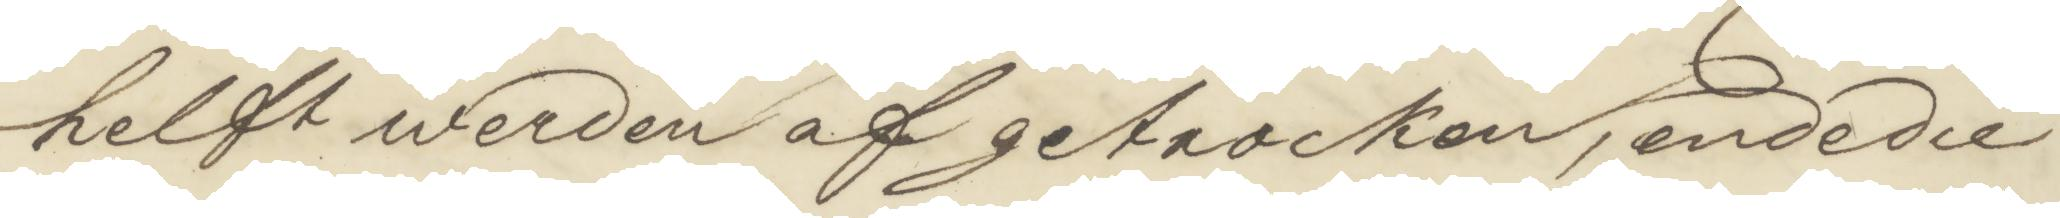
helft werden af getrocken, ende die
